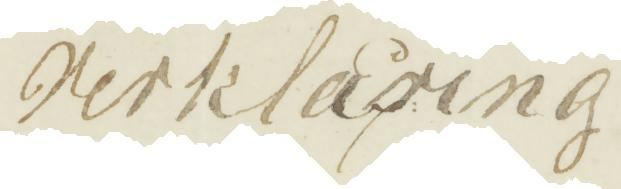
Verklaring
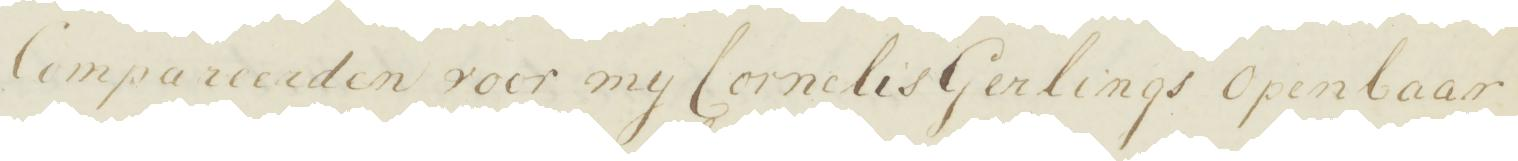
Compareerden voor my Cornelis Gerlings Openbaar
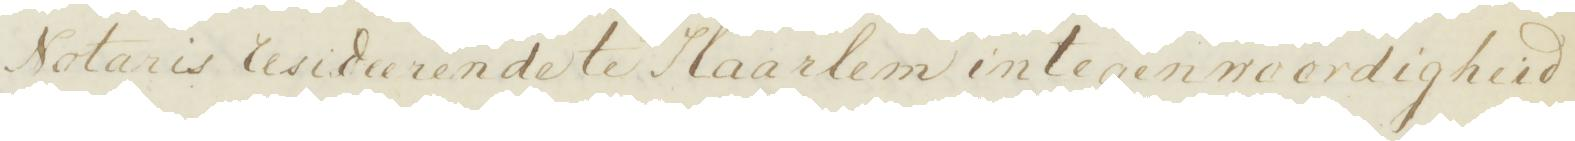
Notaris resideerende te Haarlem in tegenwoordigheid
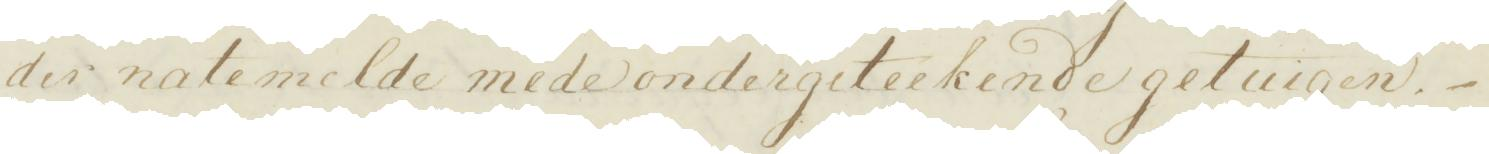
der natemelde mede ondergeteekende getuigen.-
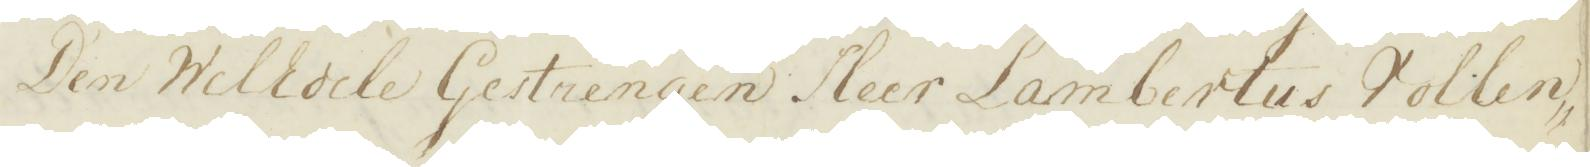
Den WelEdele Gestrengen Heer Lambertus Vollen„
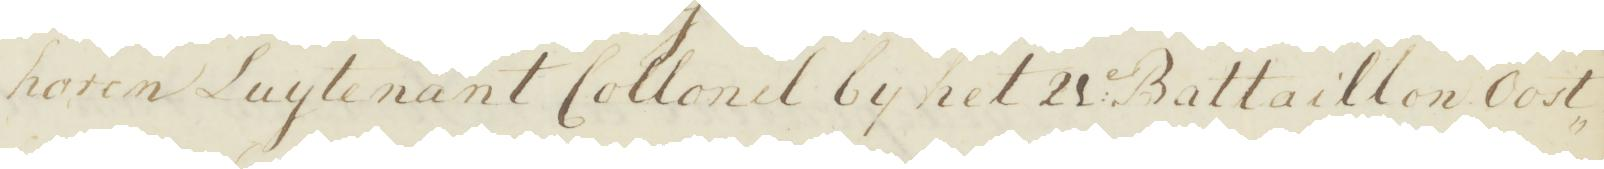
hoven Luytenant Collonel by het 21:e Battaillon Oost„
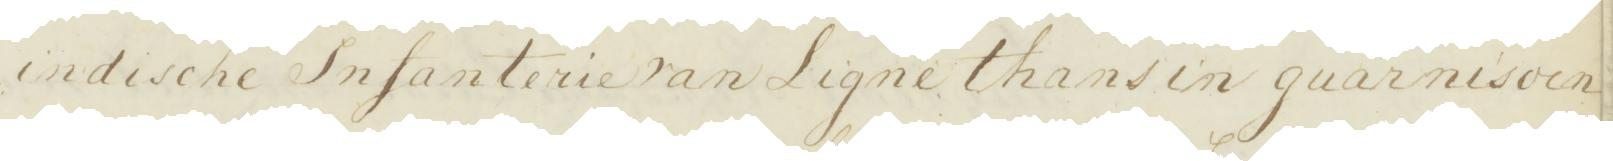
indische Infanterie van Ligne thans in guarnisoen
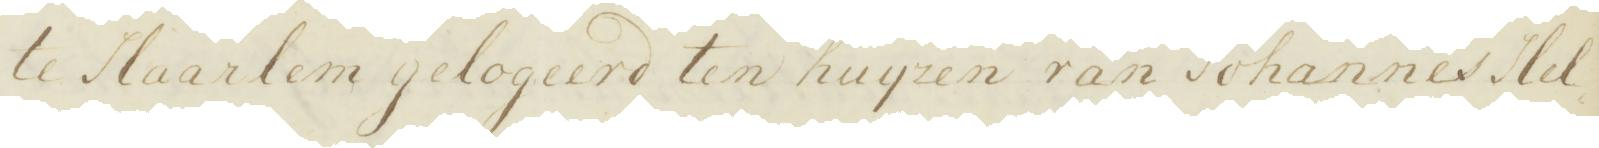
te Haarlem gelogeerd ten huyzen van Johannes Hel„
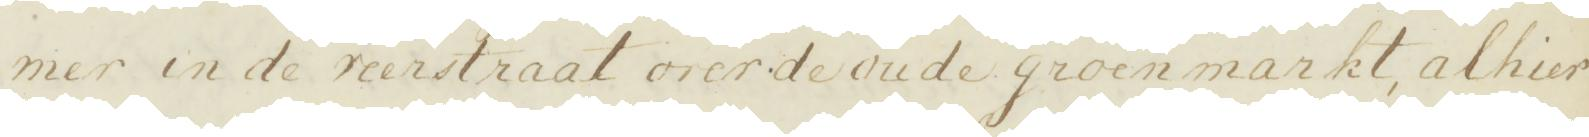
mer in de veerstraat over de oude groen markt, alhier
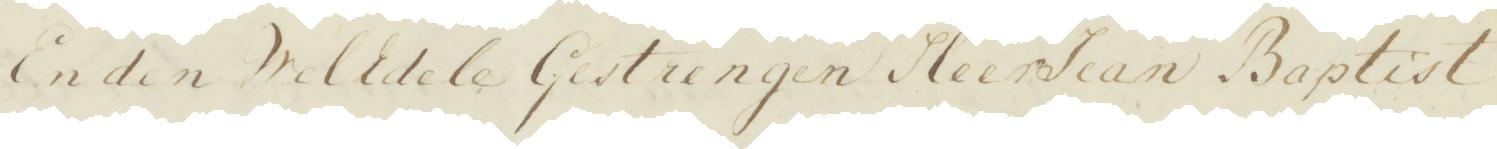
En den WelEdele Gestrengen Heer Iean Baptist
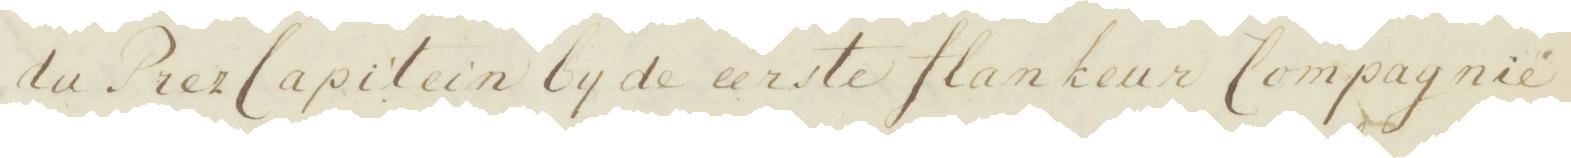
du Prez Capitein bij de eerste flankeur Compagnie
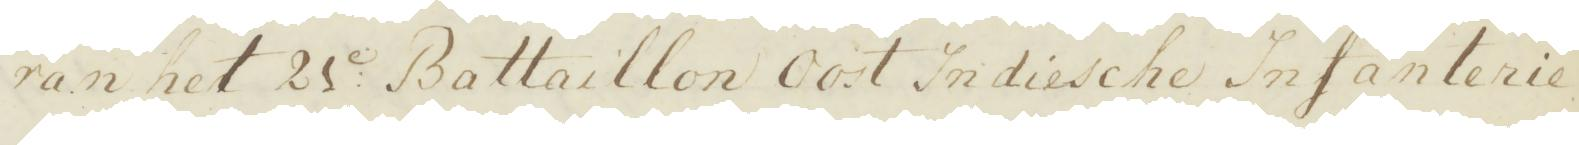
van het 25:e Battaillon Oost Indiesche Infanterie
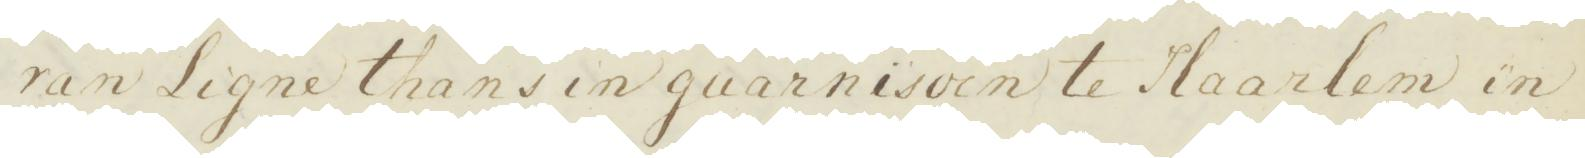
van Ligne thans in guarnisoen te Haarlem in
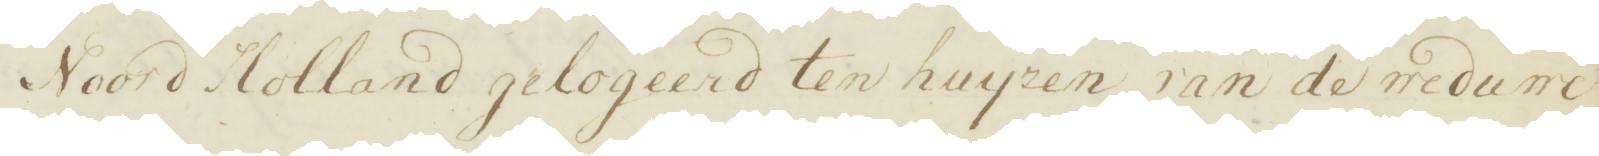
Noord Holland gelogeerd ten huyzen van de weduwe
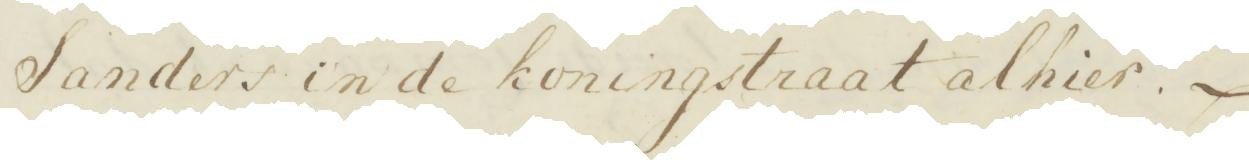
Sanders in de koningstraat alhier.—
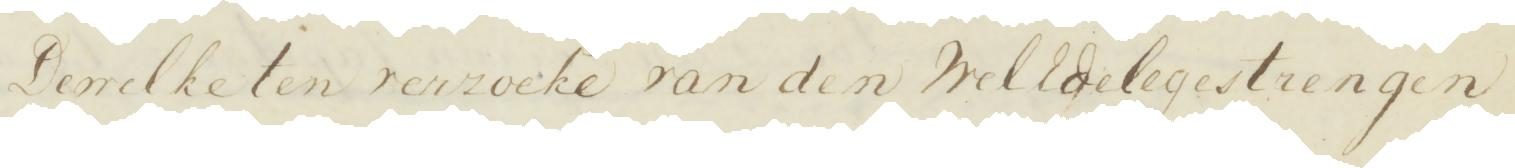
Dewelke ten verzoeke van den wel Edelegestrengen
